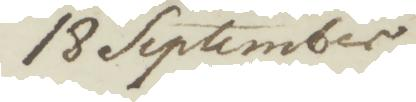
18 September
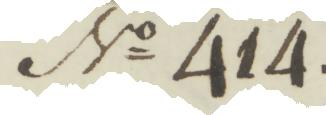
N=o 414
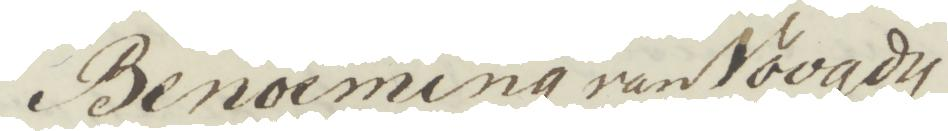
Benoeming van Voogdy
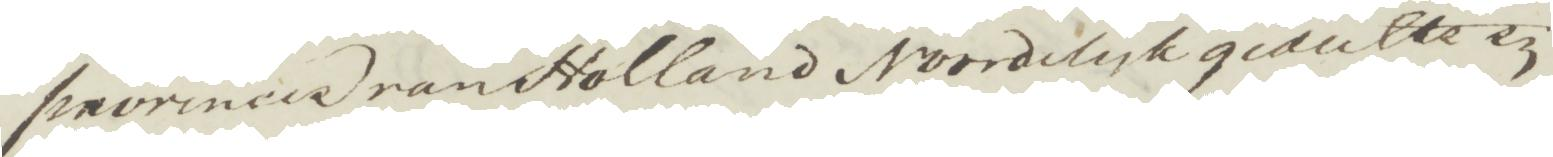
provincie van Holland Noordelyk gedeelte en
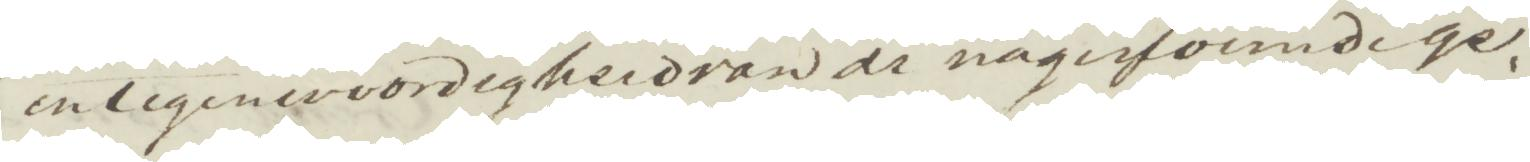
in tegenwoordigheid van de na genoemde ge„
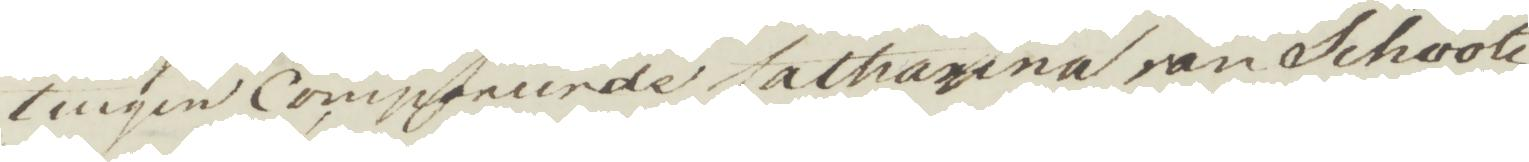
tuigen Compareerde Catharina van Schooten
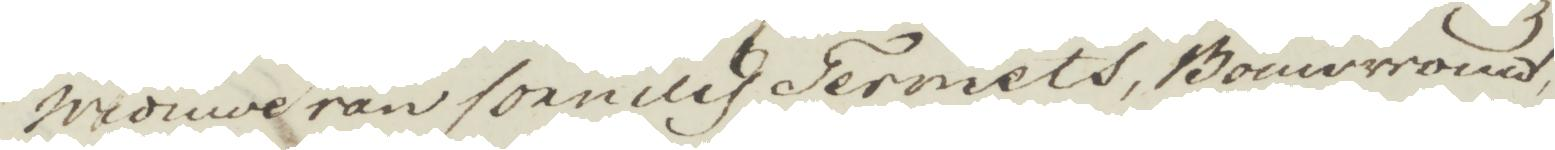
weduwe van Cornelis Termets, Bouwvrouw,
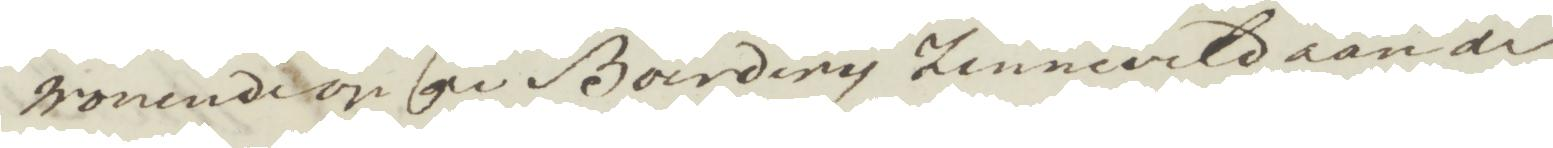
wonende op de Boerdery Zinneveld aan de
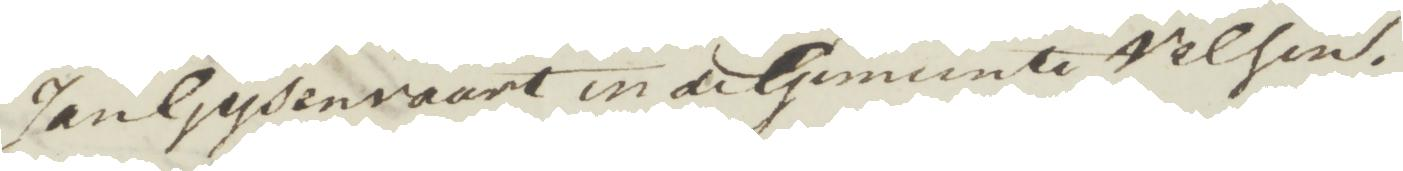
Jan Gysenvaart in de Gemeente Velsen,
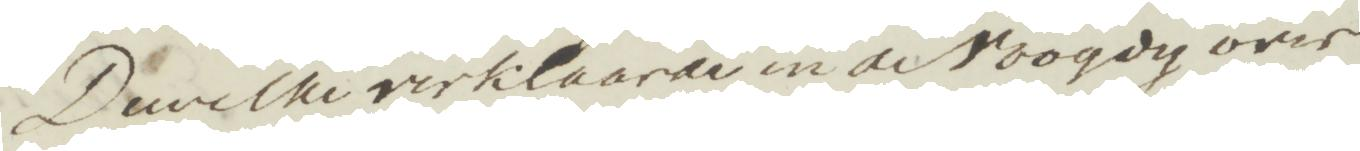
Dewelke verklaarde in de Voogdy over
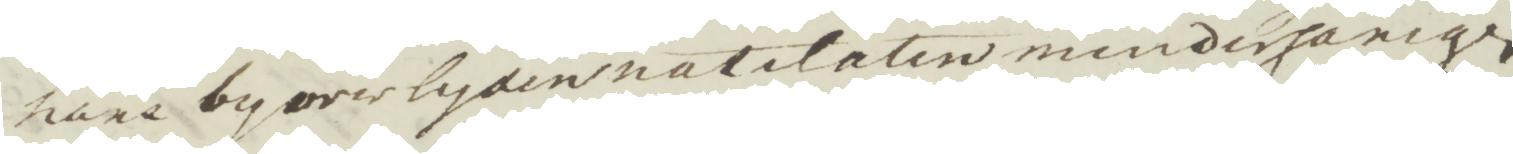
hare by overlyden na te laten minderjarigen
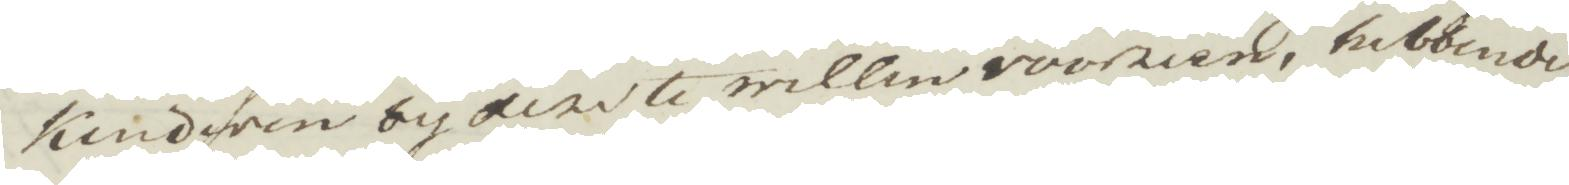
kinderen by deze te willen voorzien, hebbende
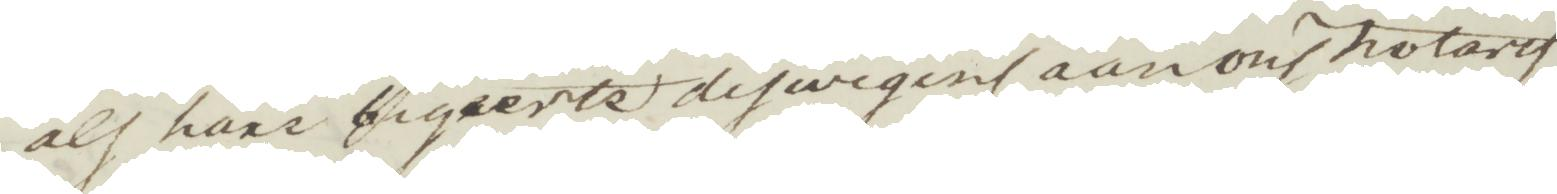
als hare begeerte deswegen aan ons notaris
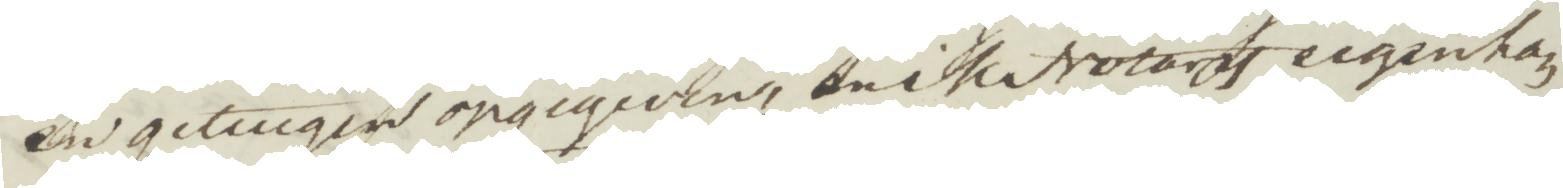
en getuigen opgegeven, en ik Notaris eigenhan
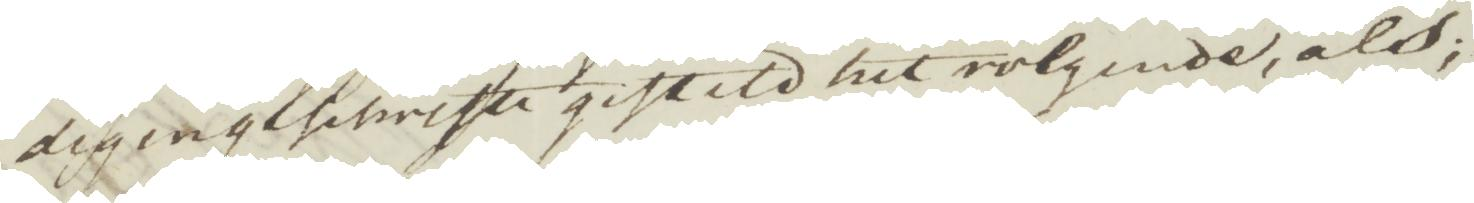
dig in geschrifte gesteld het volgende, als:
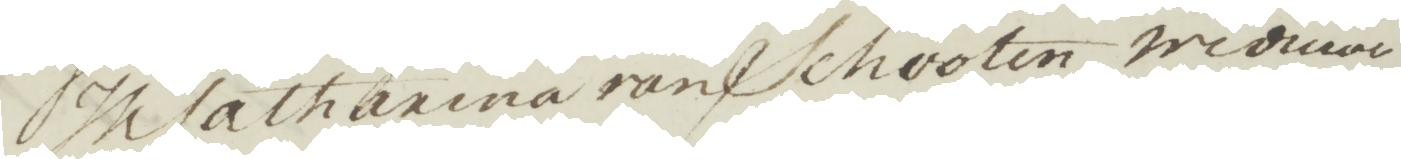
Ik Catharina van Schooten weduwe
